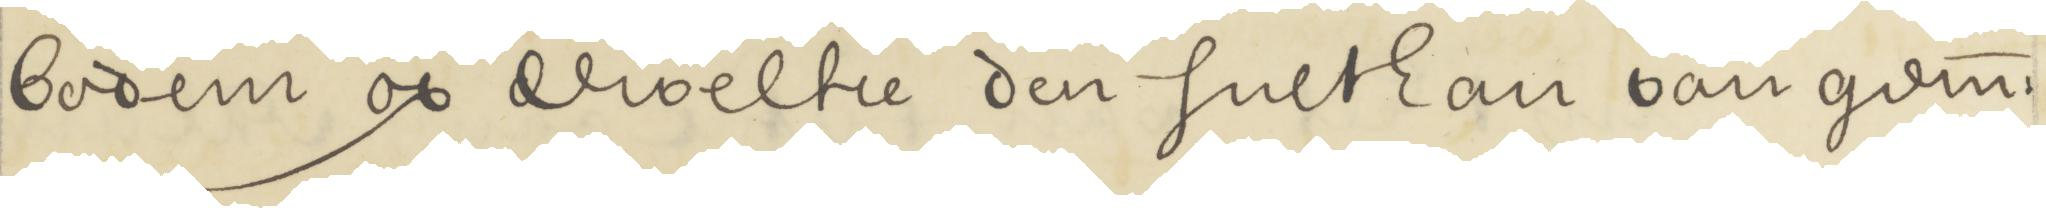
bodem op dewelke den sulthan van gem:
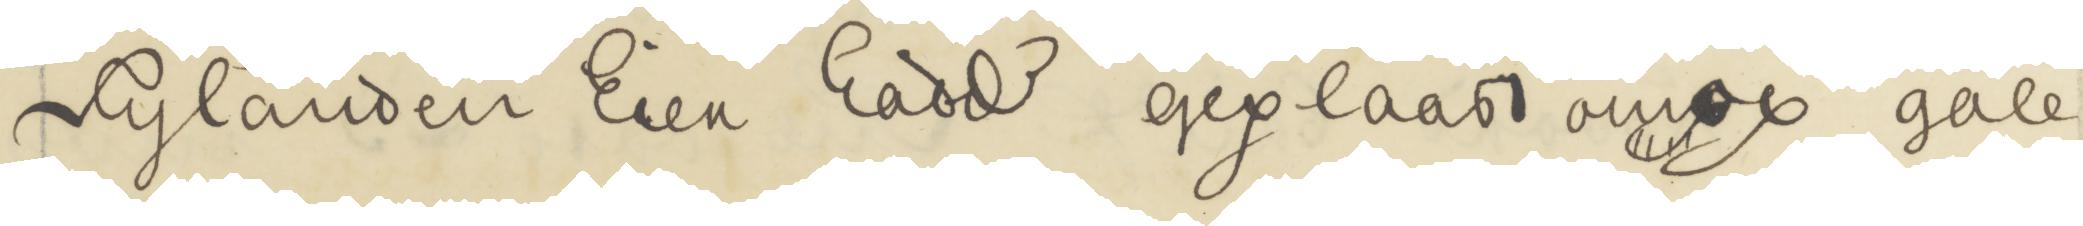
Eijlanden hier hadde geplaast om op gale
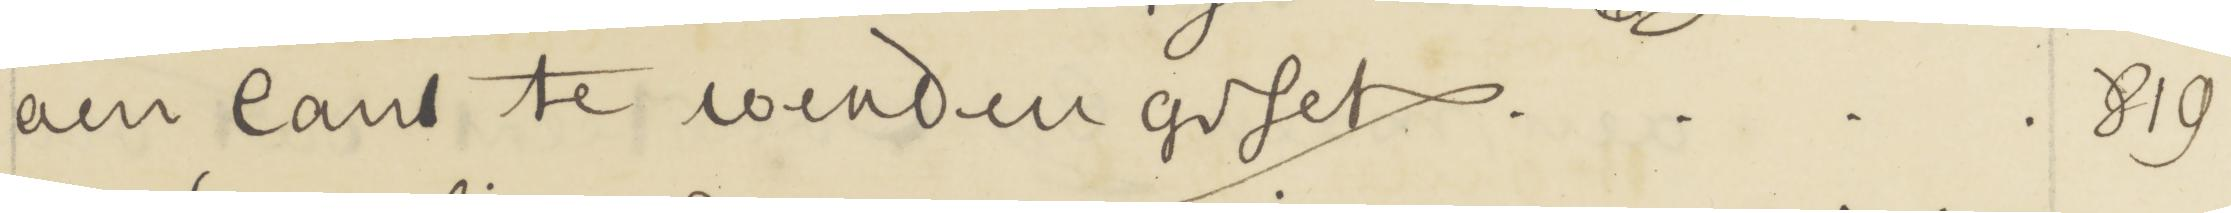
aen lant te werden geset . . . . 819
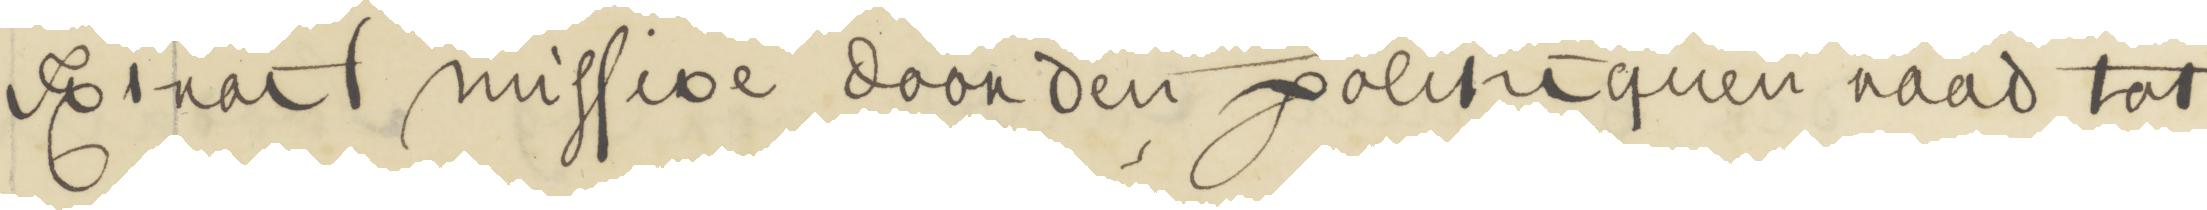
Extract missive door den politicquen raad tot
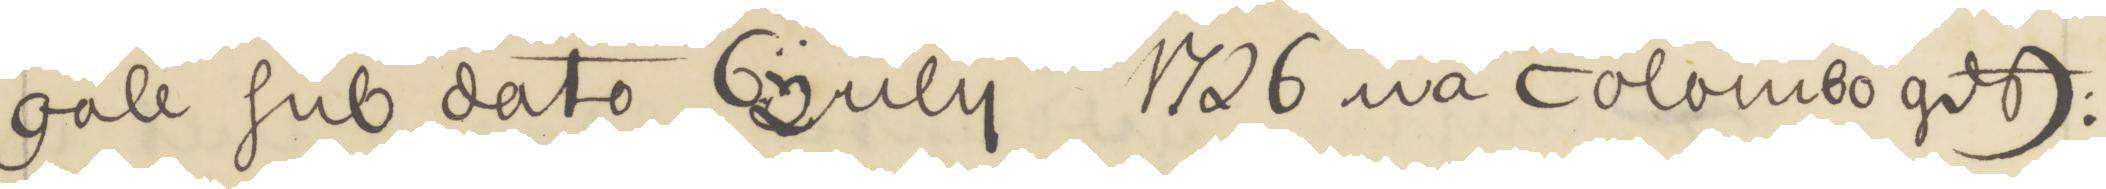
gale sub dato 6:n julij 1726 na Colombo ges:
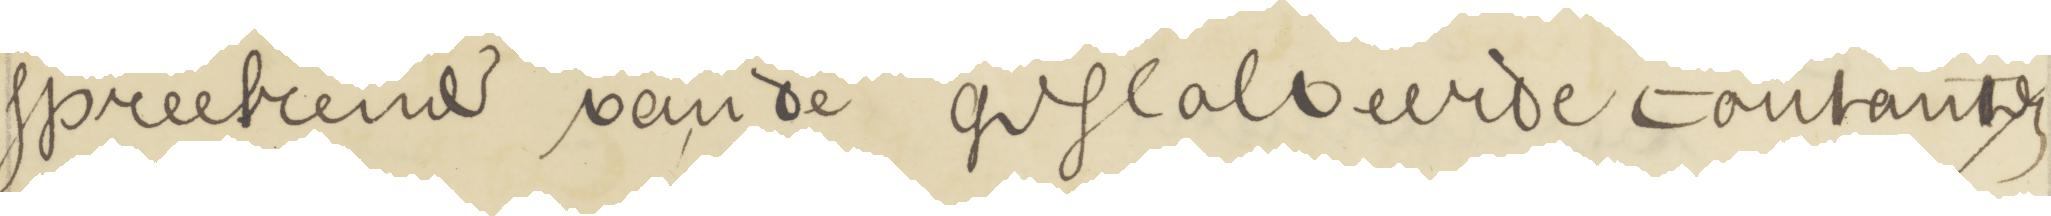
spreekende van de geslalveerde contanten
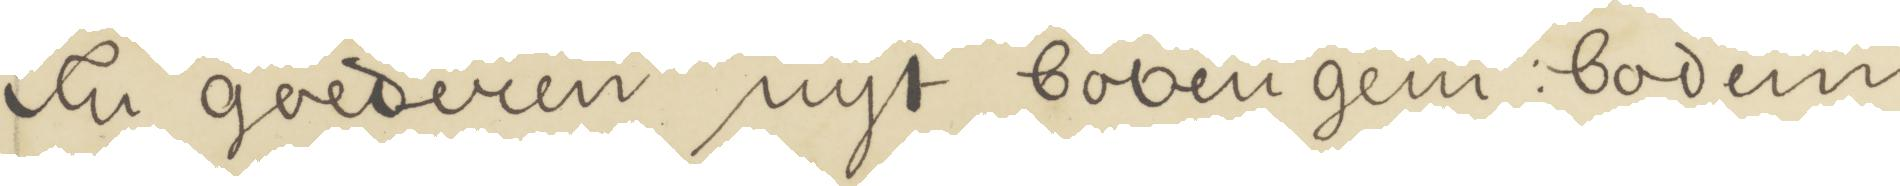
En goederen uijt boven gem: bodem
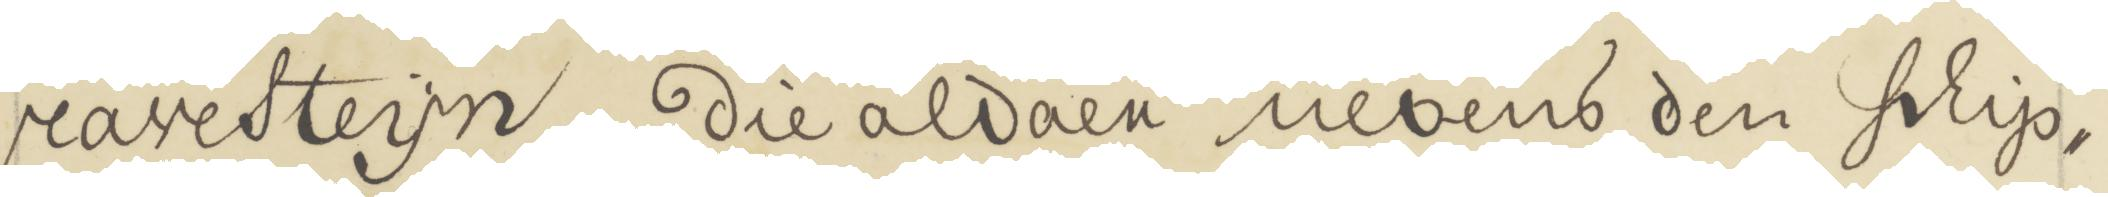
ravesteijn die aldaer nevens den schip„
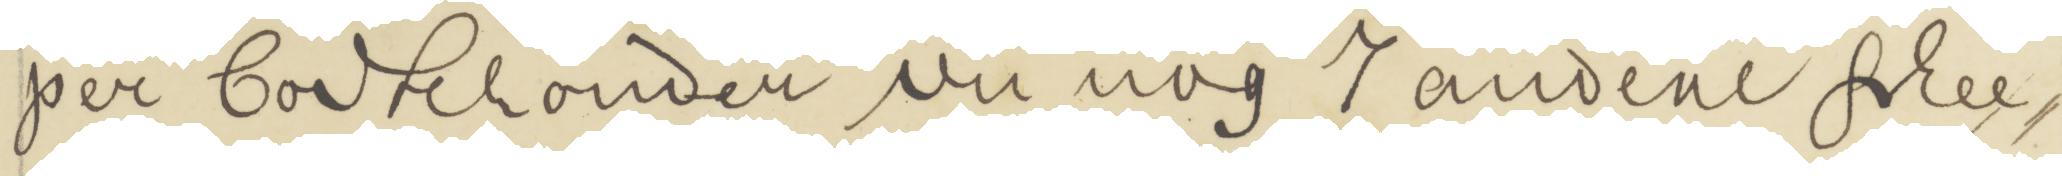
per boekhouder en nog 7 andere schee„
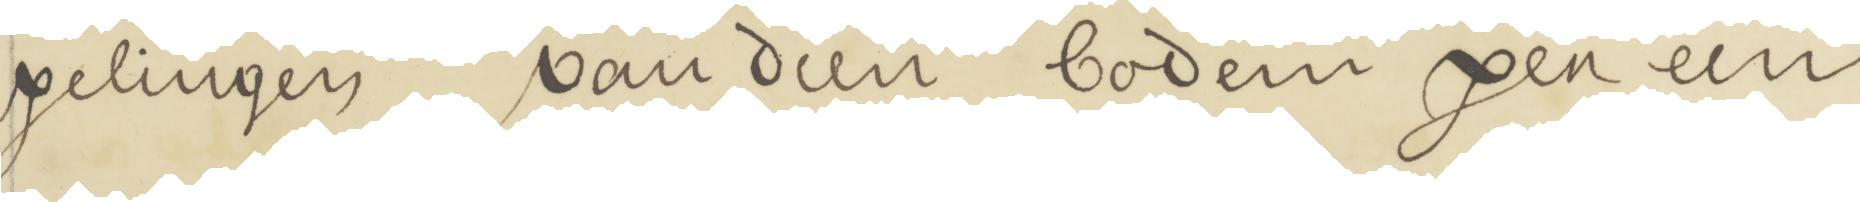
pelingen van dien bodem per een
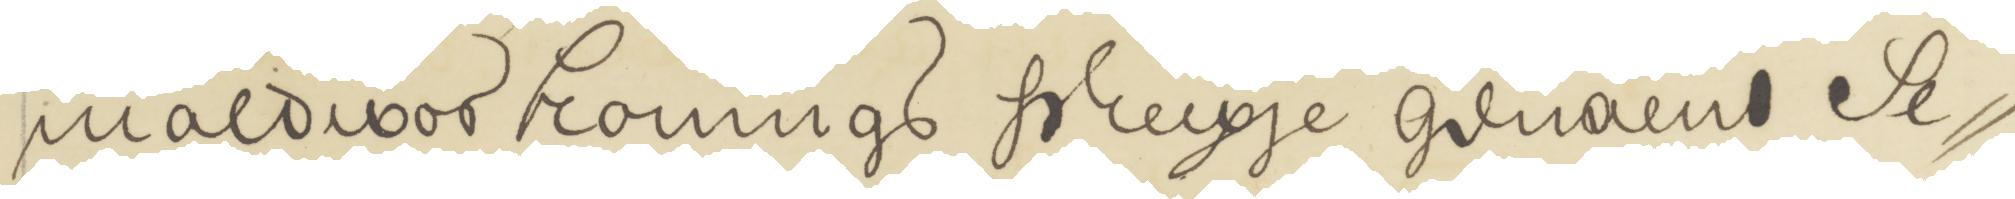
maldivos konings scheepje genaent se„
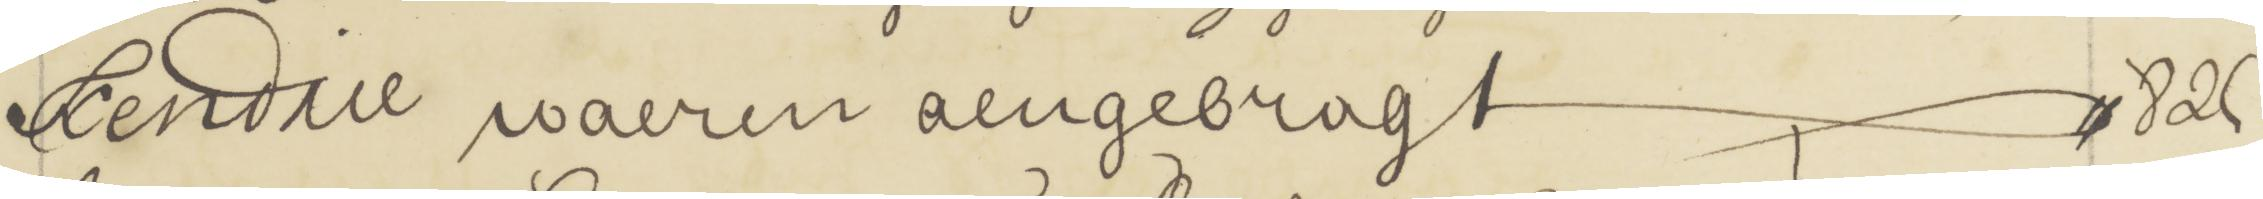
kendrie waeren aengebragt „825
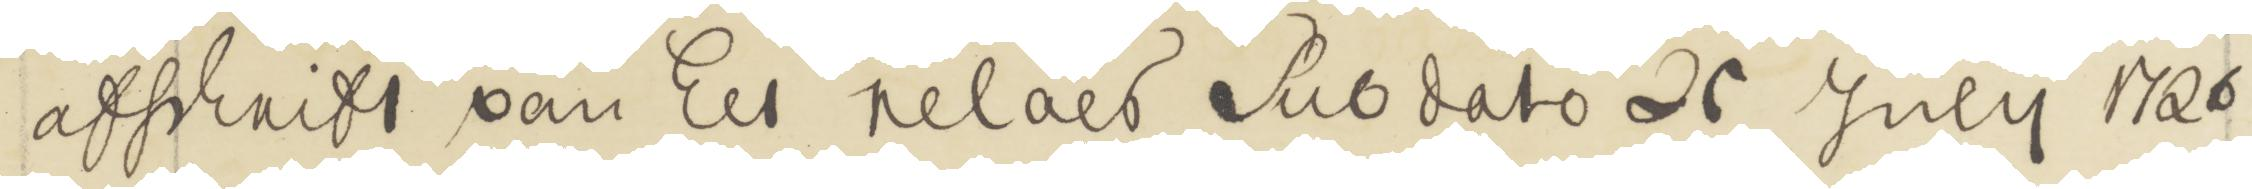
afschrift van het relaes sub dato 25 Julij 1726
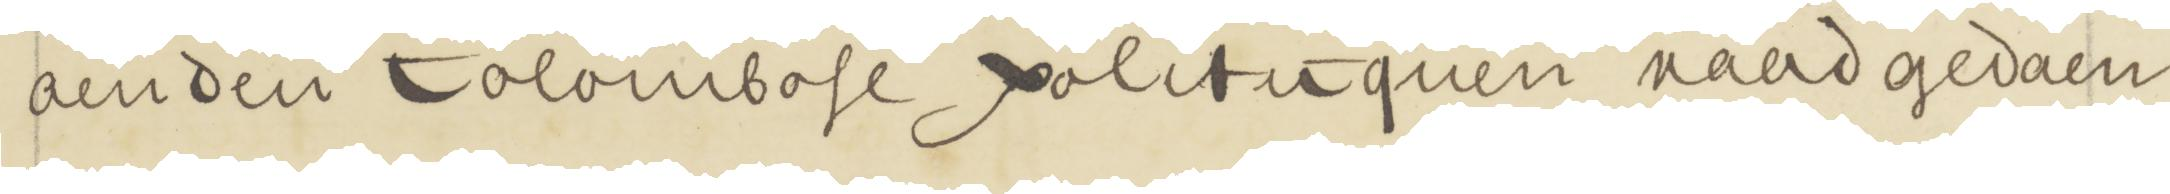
aen den Colombose politicquen raad gedaen
